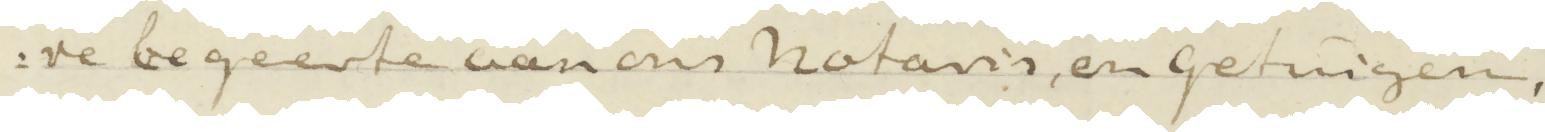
=re begeerte aan ons Notaris, en getuigen,
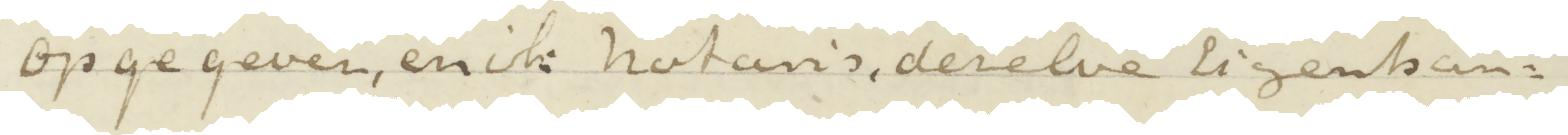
opgegeven, en ik Notaris, dezelve Eigenhan=
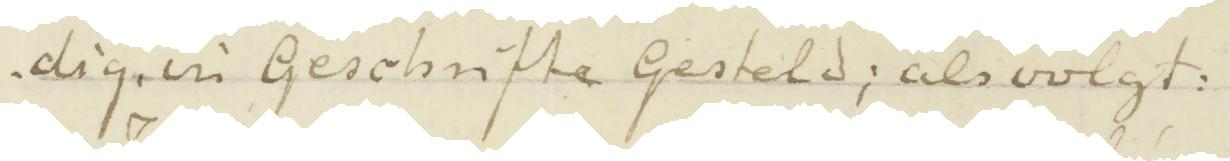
=dig in Geschrifte Gesteld; als volgt:
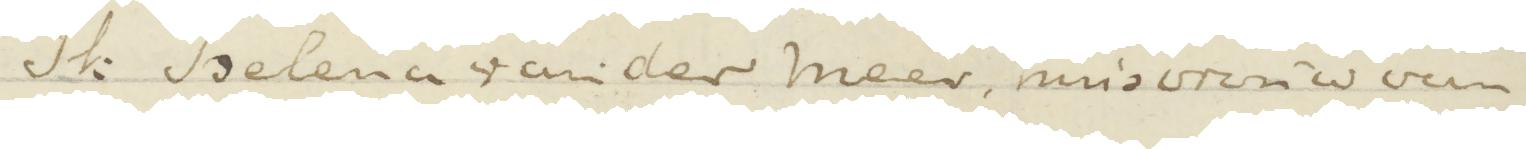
Ik Helena van der Meer, huisvrouw van
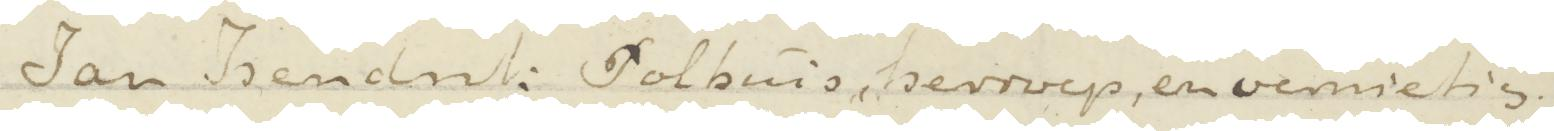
Ian Hendrik Polhuis, herroep, en vernietig.
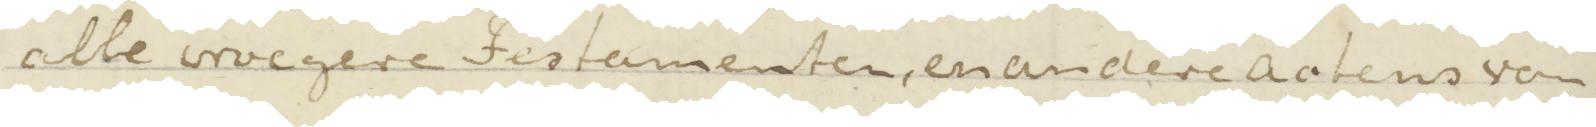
alle vroegere Testamenten, en andere actens van
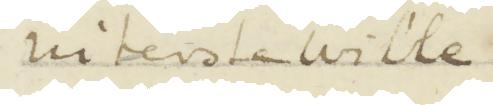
uiterste wille
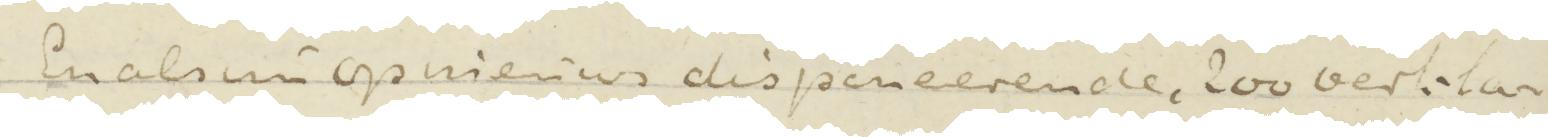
En als op nieuws disponeerende, zoo verkla=
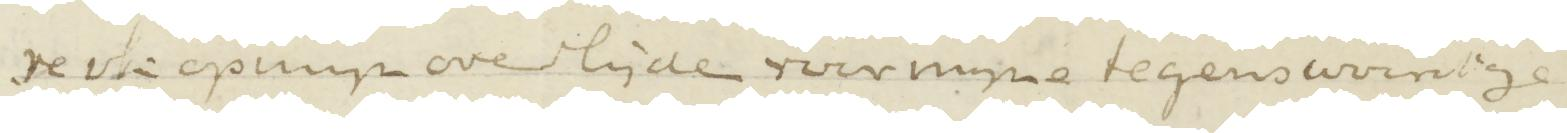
„re ik op myn overlijden voor myne tegenswoordige
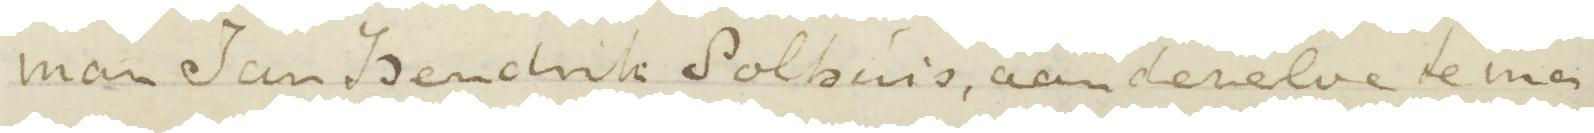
man Ian Hendrik Polhuis, aan dezelve te ma
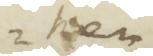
=ken
